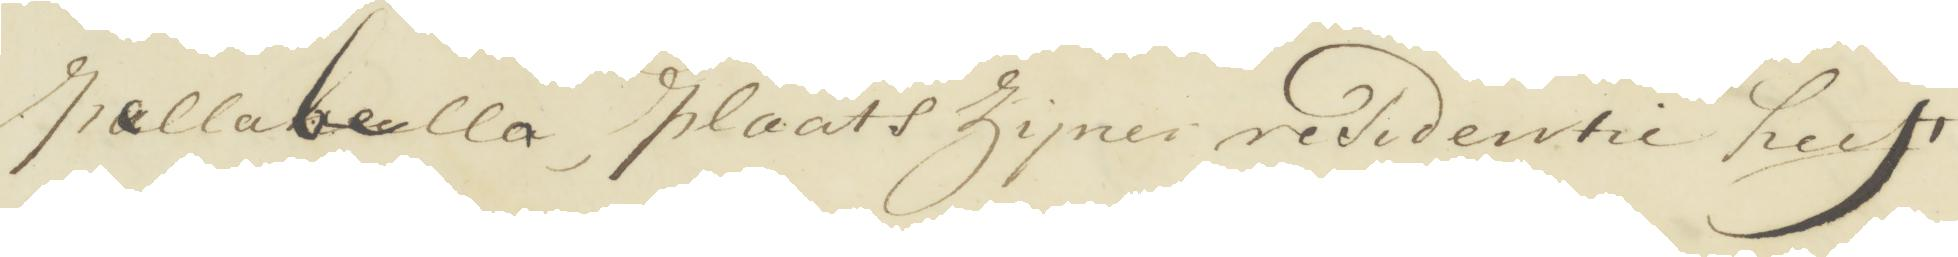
pallabella, plaats zijner residentie heeft
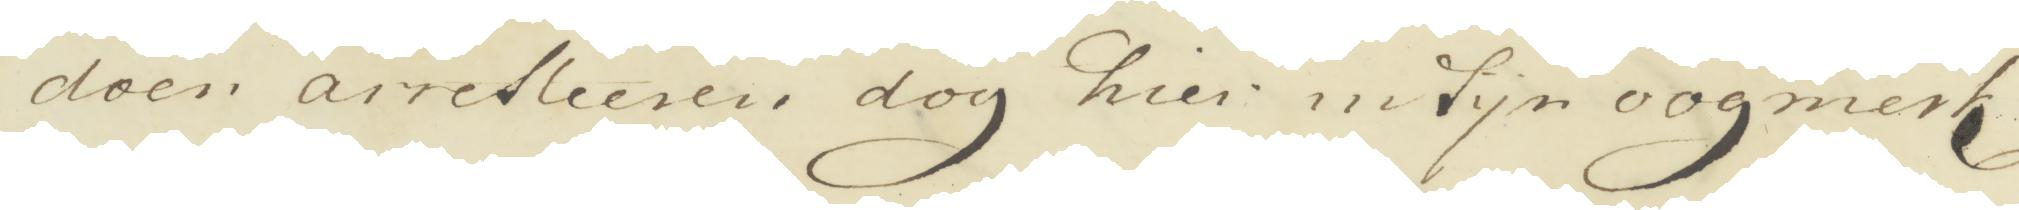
doen arresteeren dog hier in sijn oogmerk
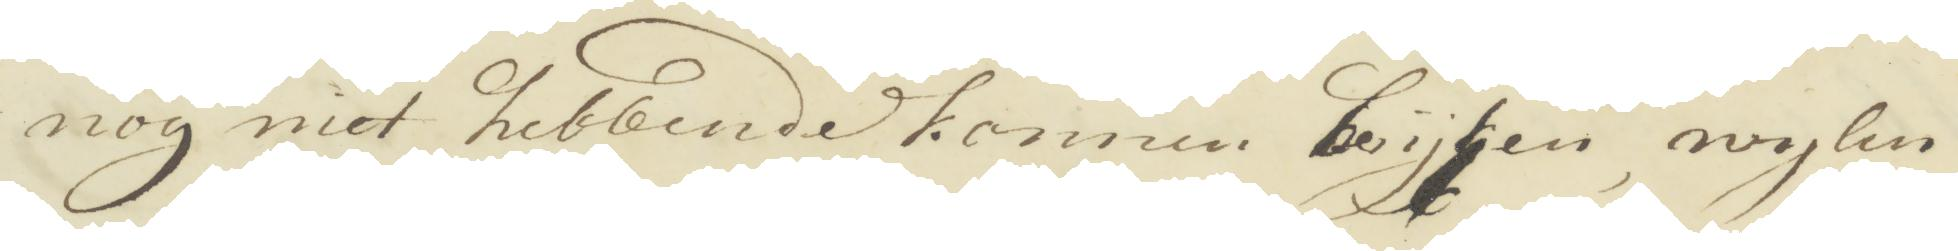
nog niet hebbende konnen berijken, wylen
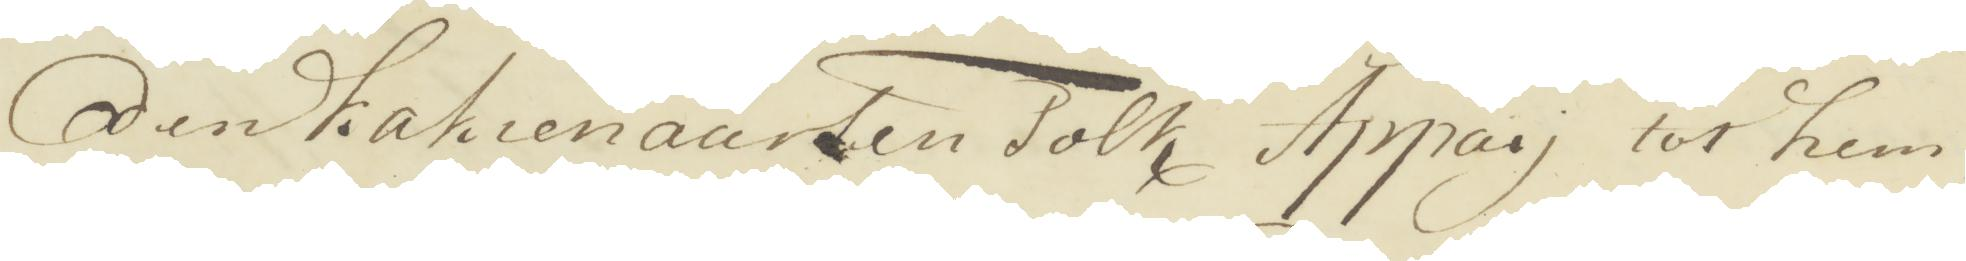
den kakienaarsen Tolk Appaij tot hem
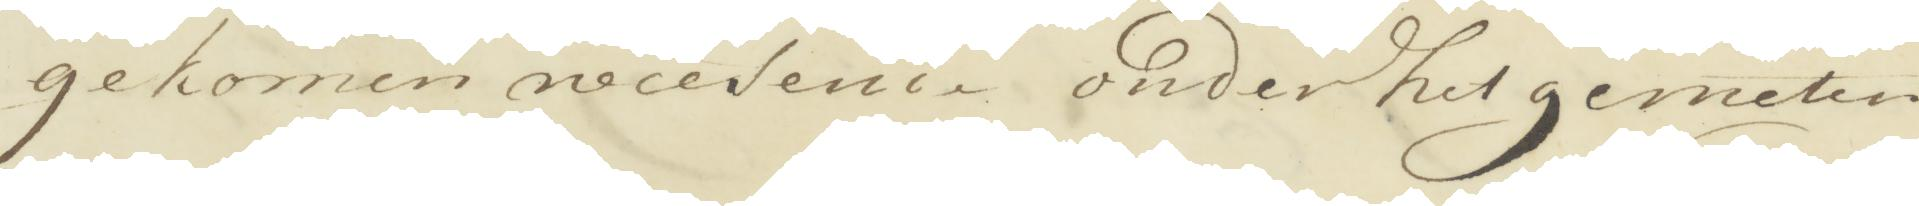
gekomen weesende onder het genieter
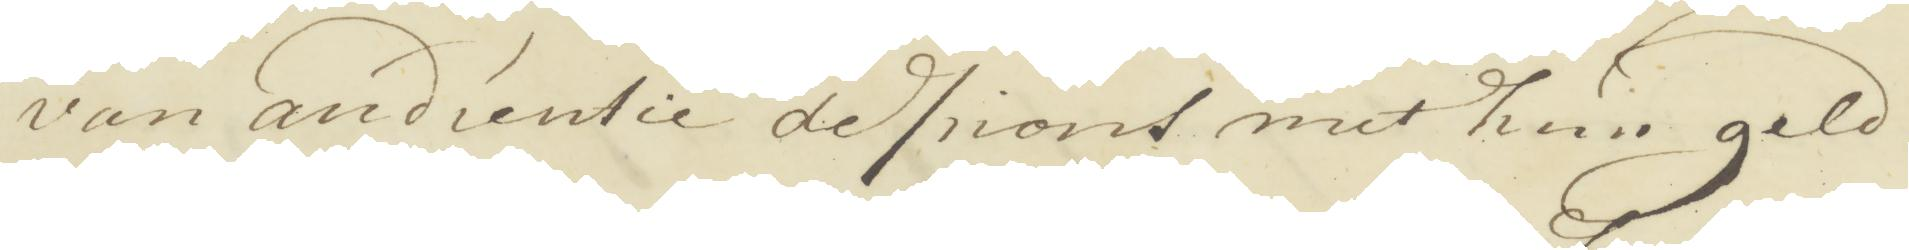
van audientie de pions met hun geld
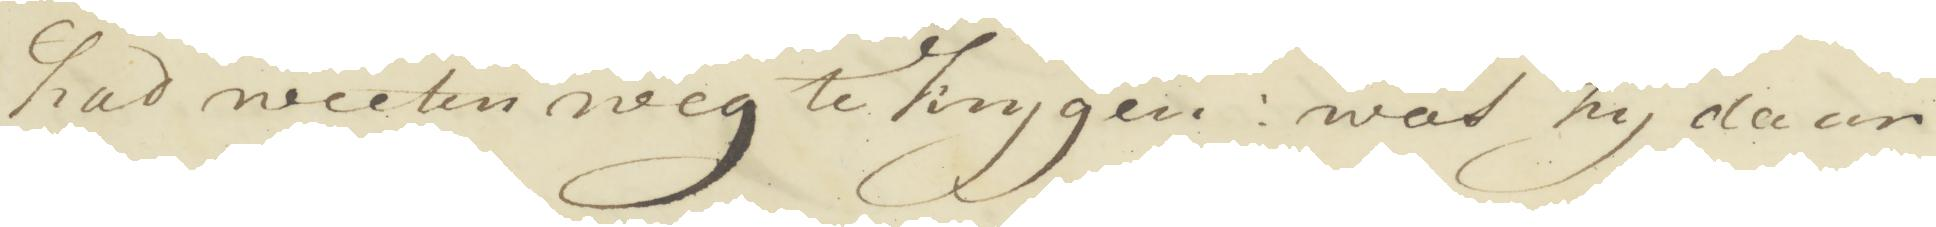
had weeten weg te krygen: was hy daar
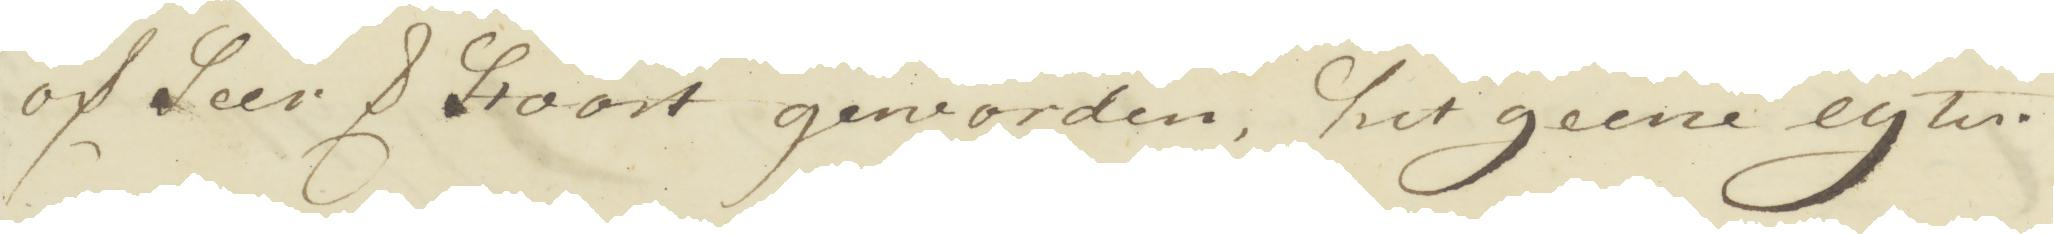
over seer verstoort geworden, het geene egter
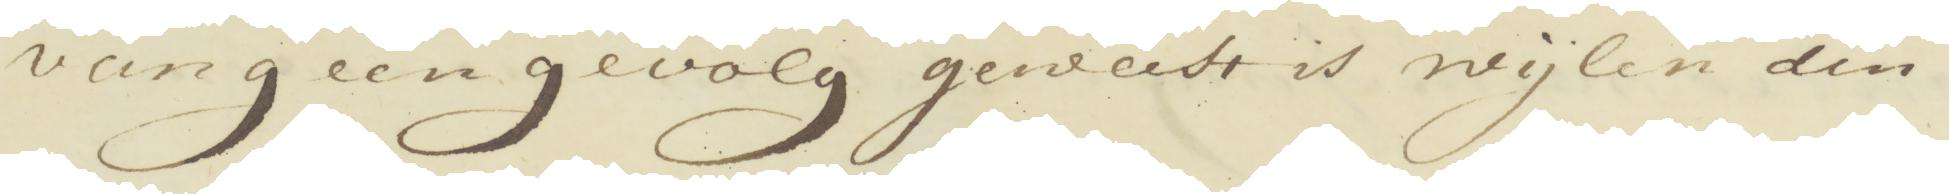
van geen gevolg geweest is wijlen den
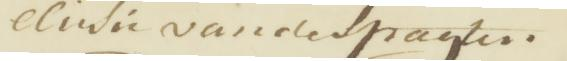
elusie van des pagter
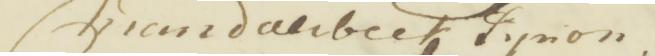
mandakbeek syn on„
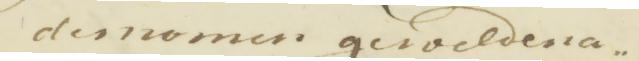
dernomen geweldena„
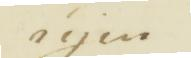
rijen
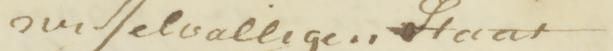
wisselvalligen staat
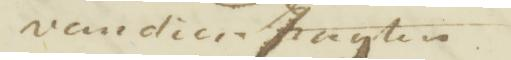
van dier pagter
